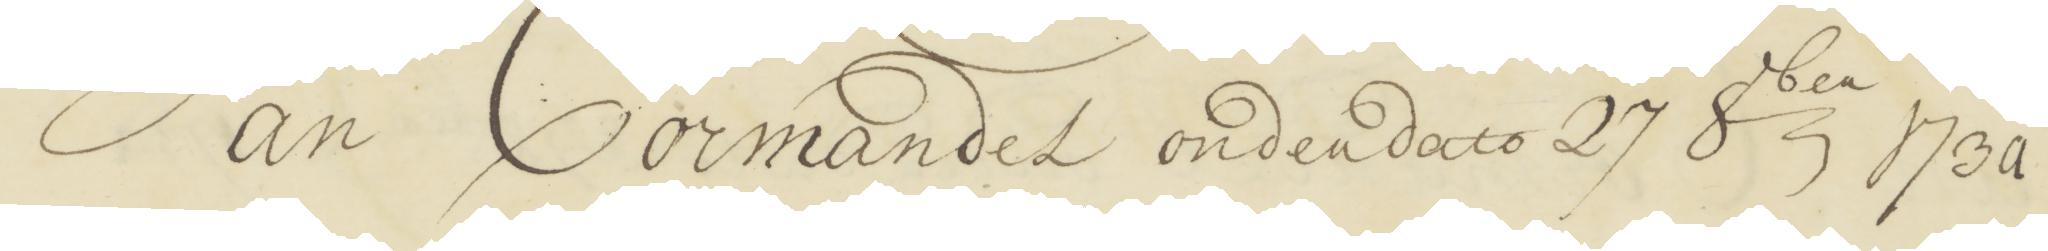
Van Cormandel onder dato 27 8„ber 1734
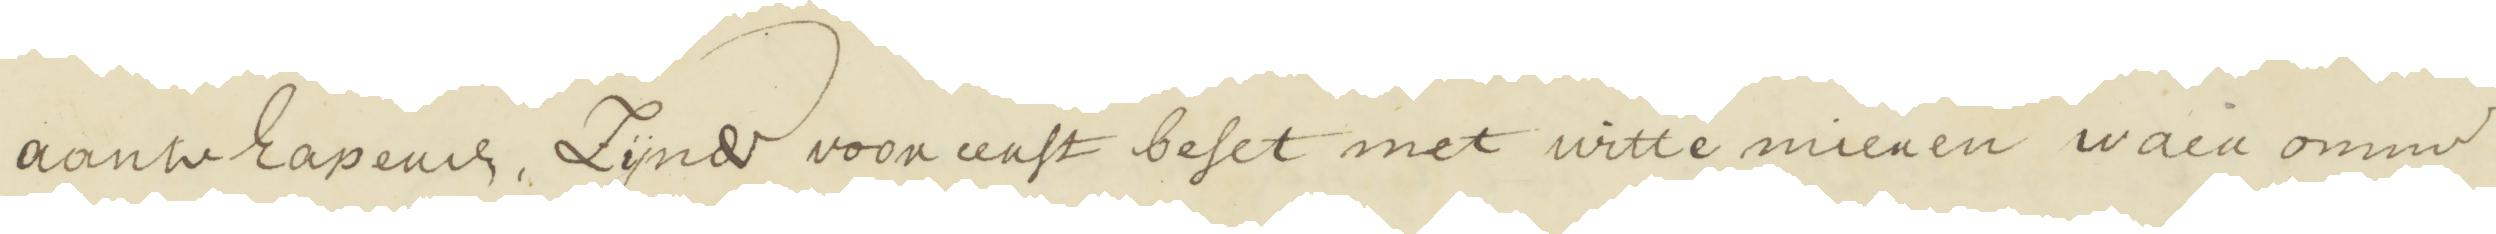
aan te haperen, Zijnde voor eerst beset met witte mieren waer omme
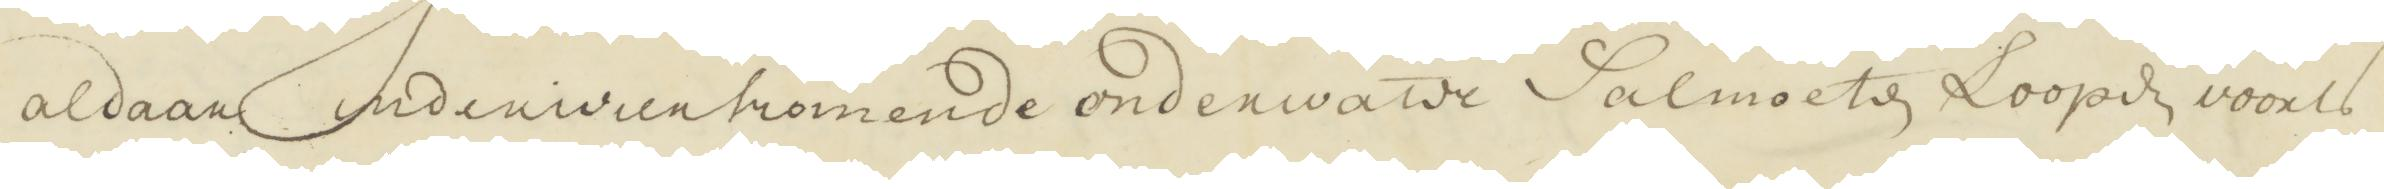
aldaar inde rivier komende onderwater Sal moeten Loopen voorts
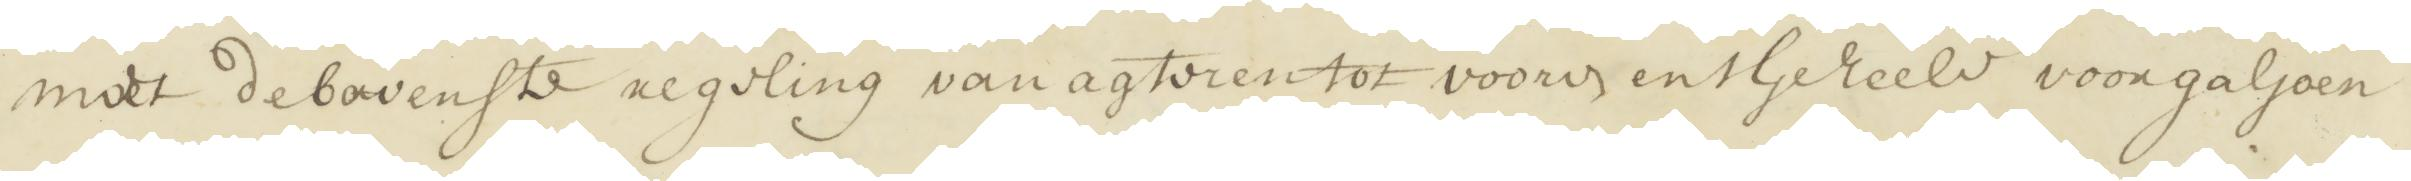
moet de bovenste regeling van agteren tot vooren ent Geheele voor galjoen
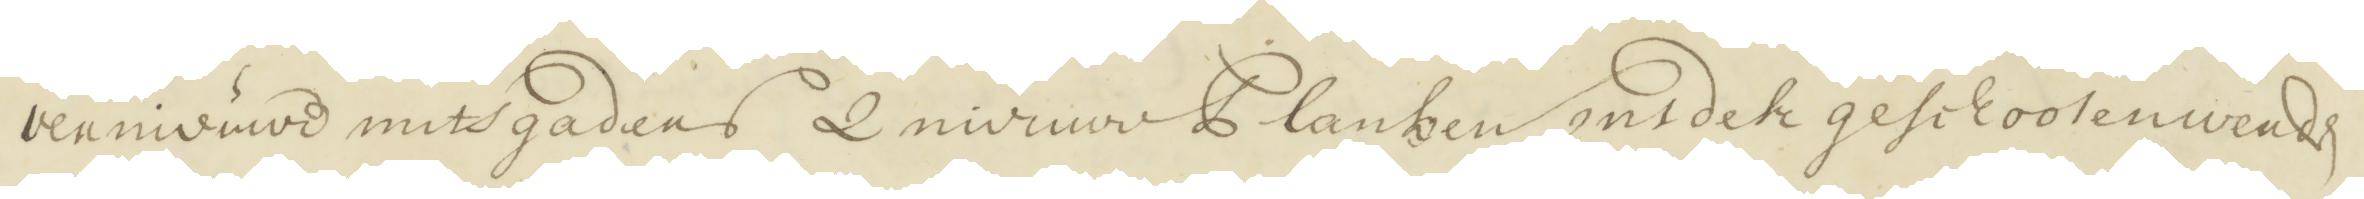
vernieuwd mitsgaders 2 nieuwe Planken jnt dek geschooten werden
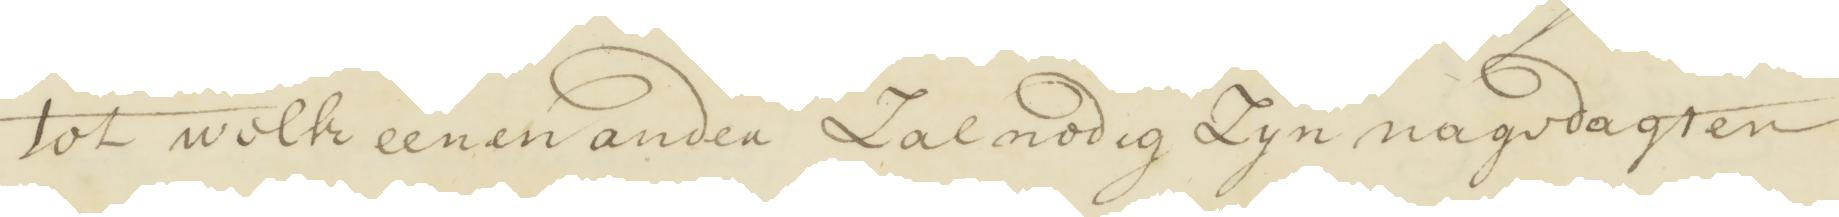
tot welk een en ander zal nodig zyn nagedagten
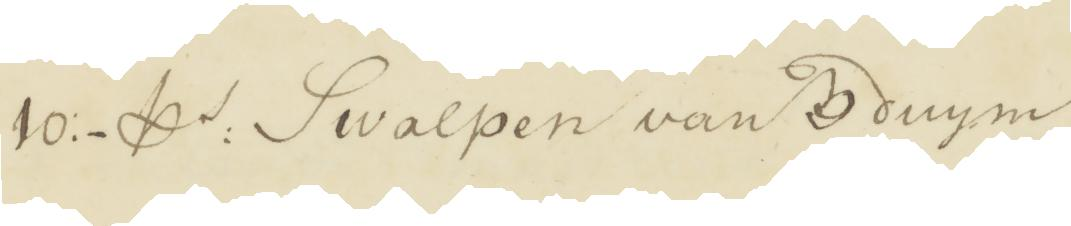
10: — p:s Swalpen van 3 duijm
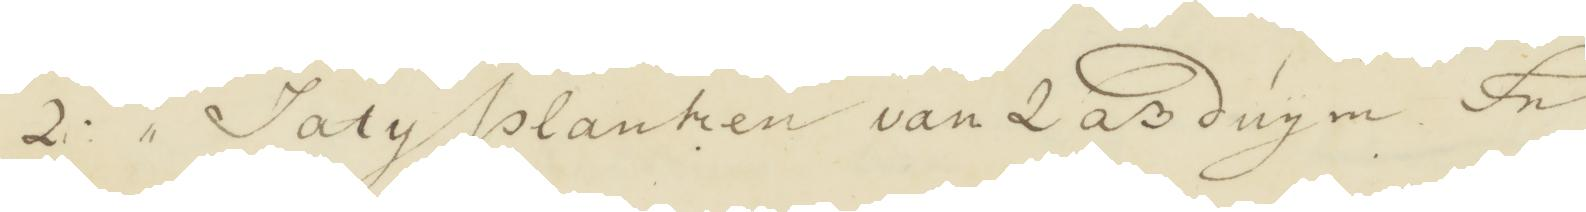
2: „ Iaty planken van 2 a 3 duijm En
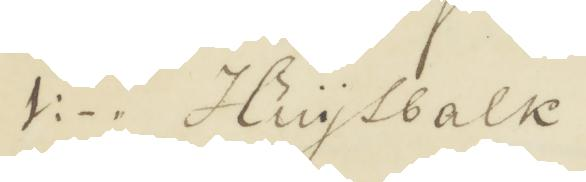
1: — „ Huijsbalk
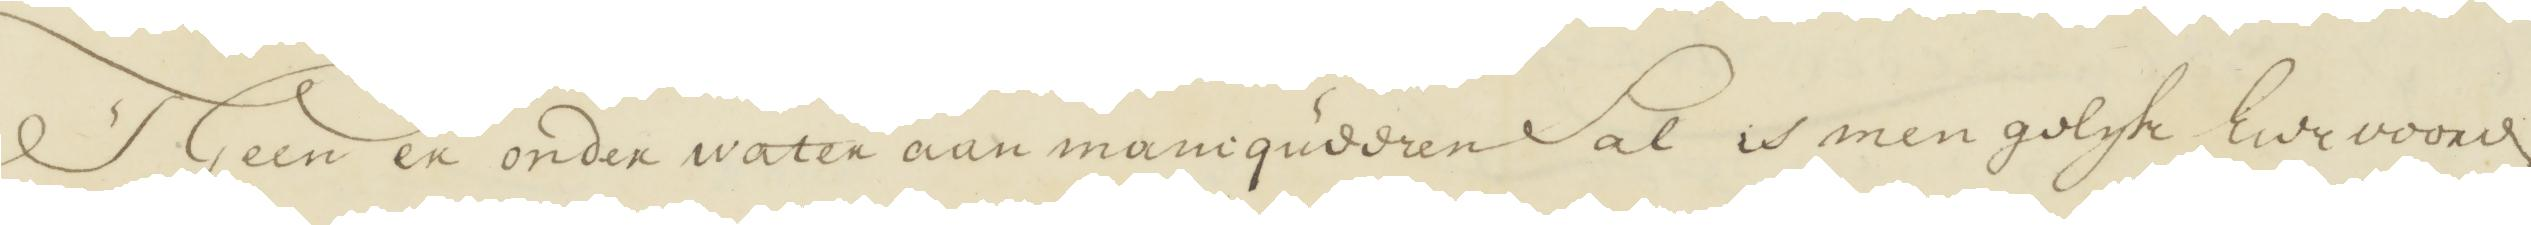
'T Geen er onder water aan mancqueeren sal is men gelyk hier vooren
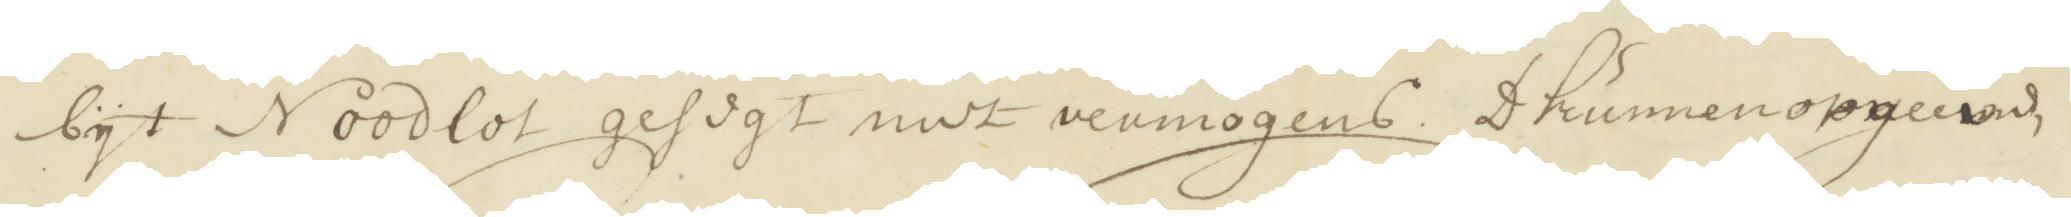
bijt Noodlot gesegt niet vermogens te kunnen opgeeven
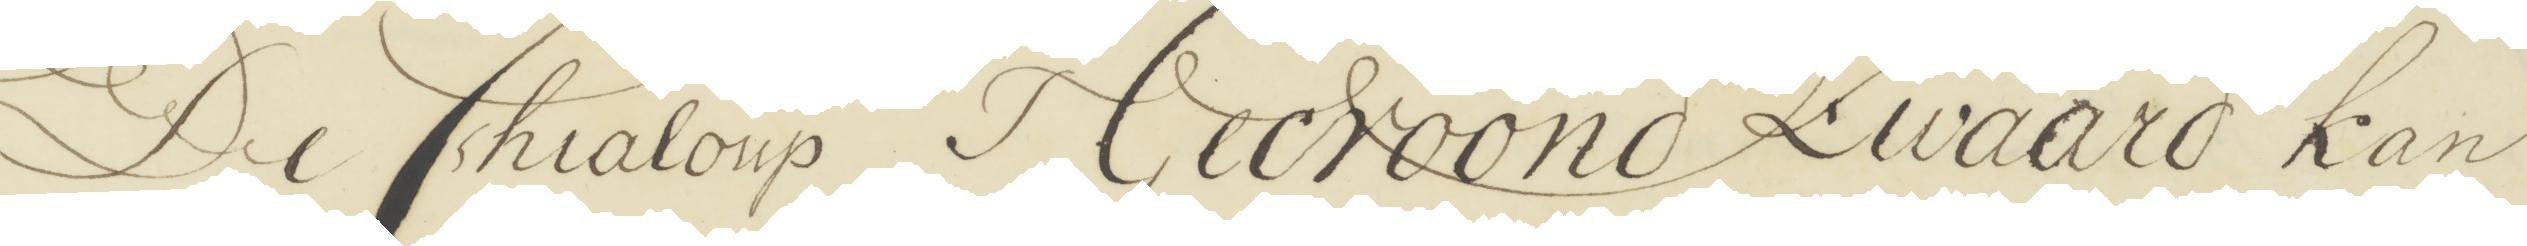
De Chialoup 'T Gecroond Zwaard kan
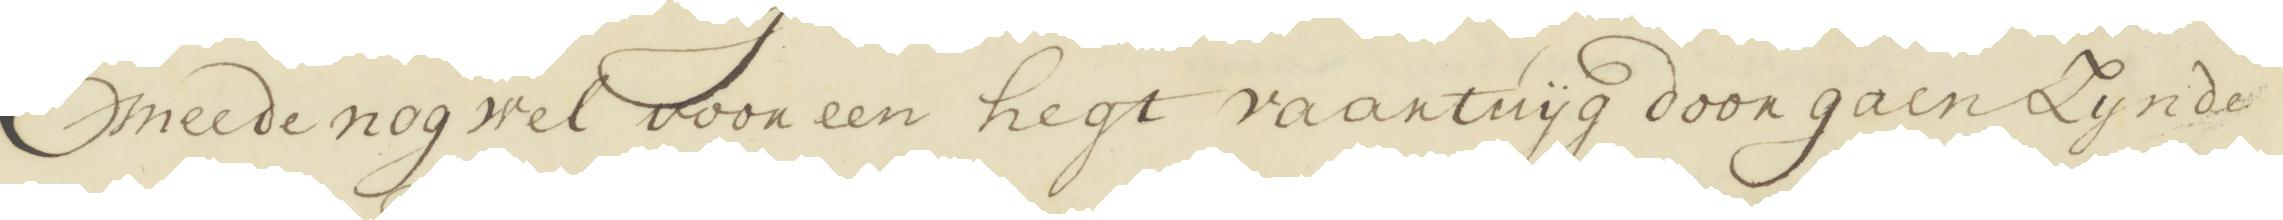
meede nog wel voor een hegt vaartuijg door gaen zynde
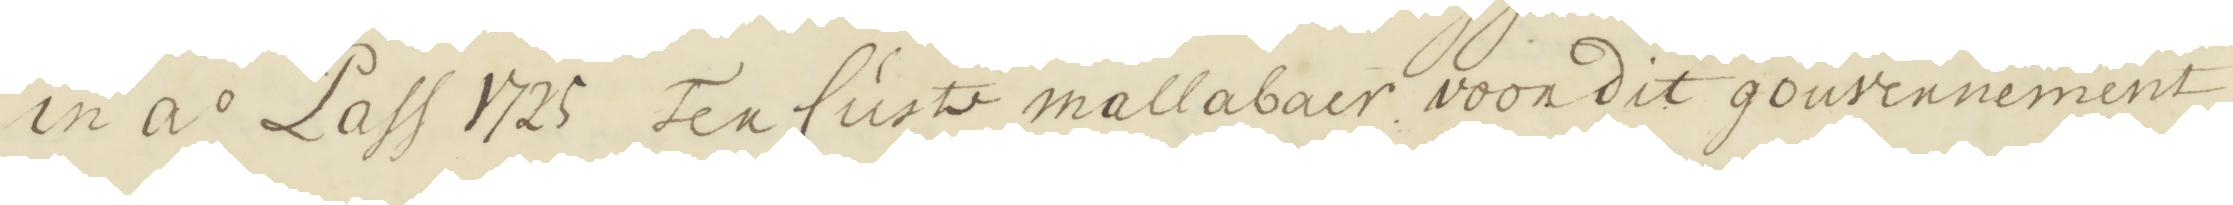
in ao Pass 1725 Ter Custe mallabaer voor dit gouvernement
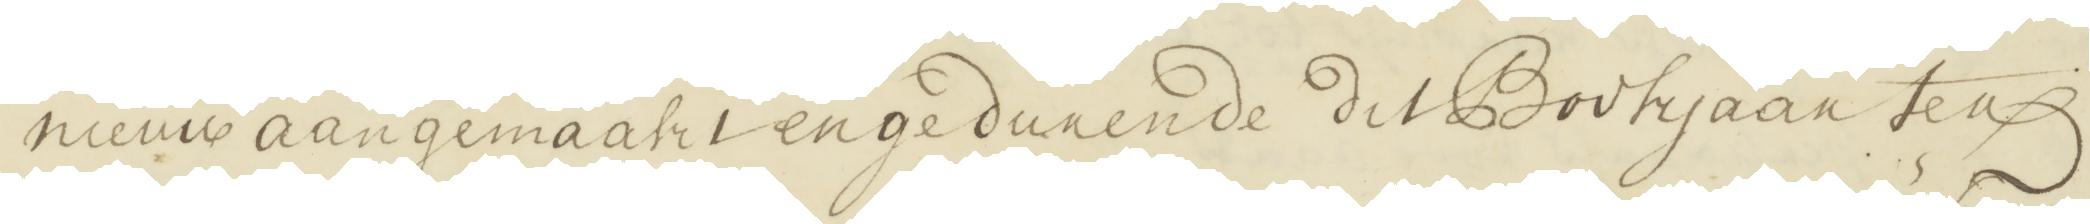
nieuw aangemaakt en gedurende dit Boekjaar ter
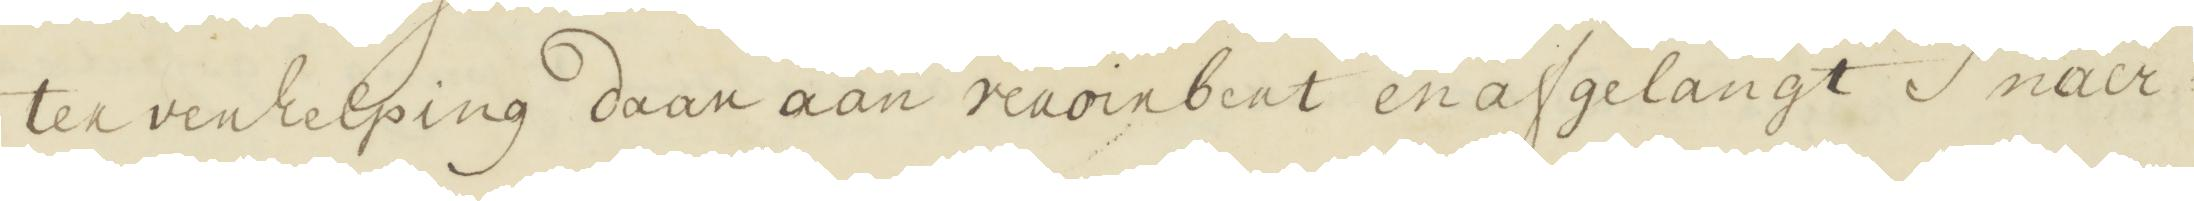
ter verhelping daar aan veroirbert en afgelangt 'T naer
